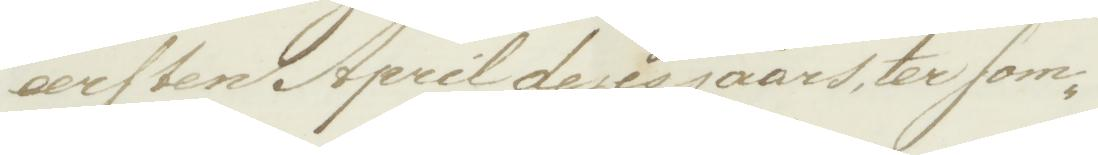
eersten April dezes jaars, ter som„
